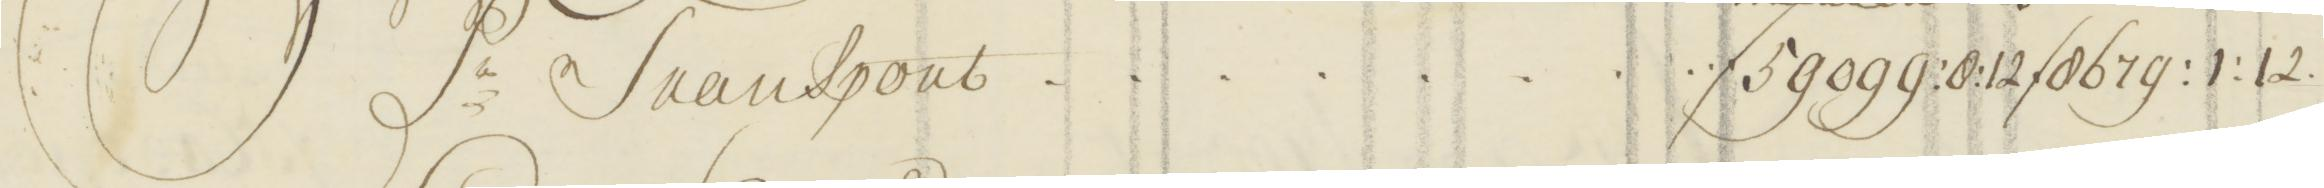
P=r Transport . . . . . . . . .ƒ59099:8:12 ƒ8679:1:12
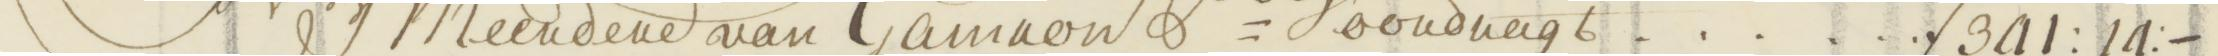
T' meerdere van Gamron P„s Voordragt . . . . . .ƒ341: 14:–
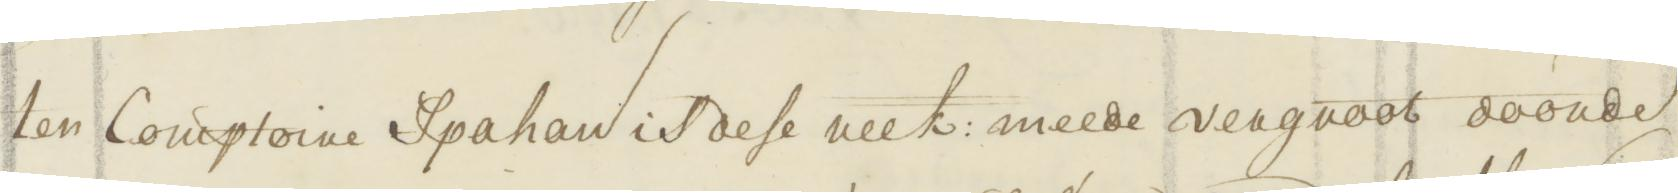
ten Comptoire spahan is dese reek: meede vergroot door de
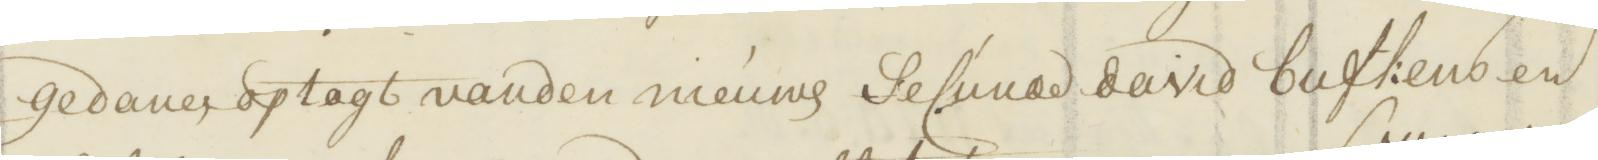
gedanen optogt vanden nieuwen secunde david bufkens en
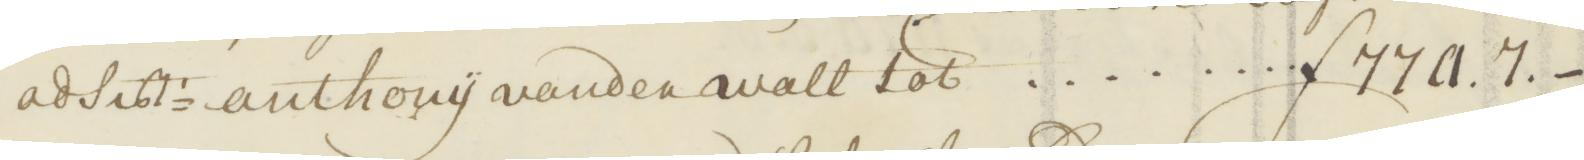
adsist=t anthonij vander wall tot . . . . . . . .ƒ774. 7. –
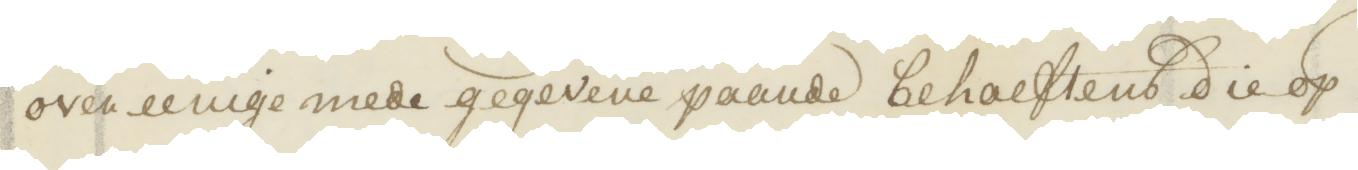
over eenige mede gegevene paarde behoeftens die op
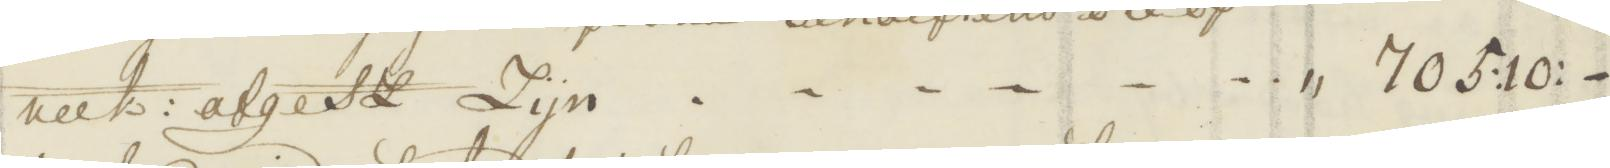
reek: afgesz zijn - – – – – – - . „ 705:10: –
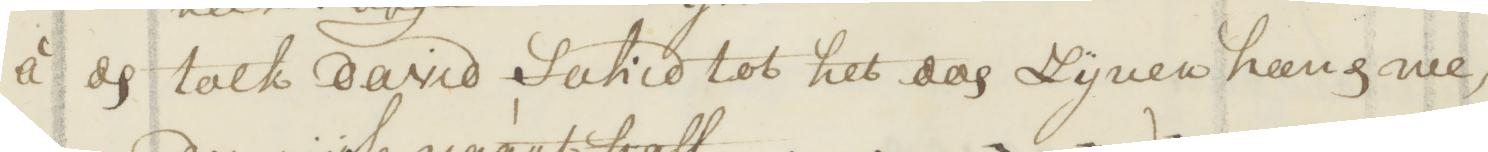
à den tolk david sahid tot het aen zijner heen en we
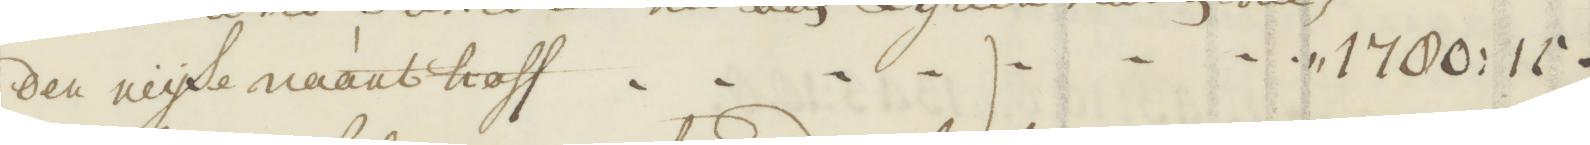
der reijse naar't hoff - - - - - - - .„1780:15
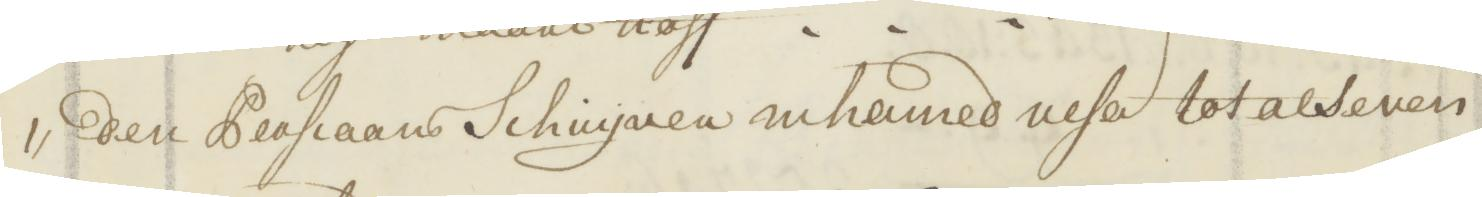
„ den Persiaans schrijver mhamed resa tot alseven
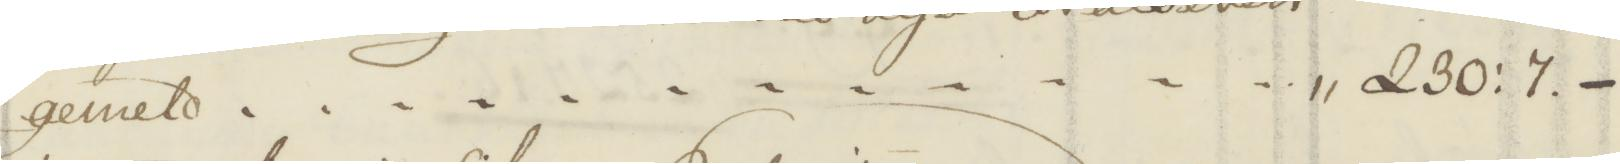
gemeld . . - - - - - - - - - - - . „ 230: 7. –
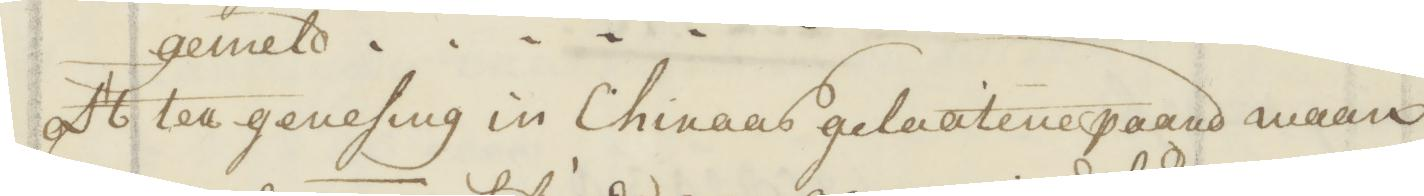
over't ter genesing in Chiraas gelaatene paard maar
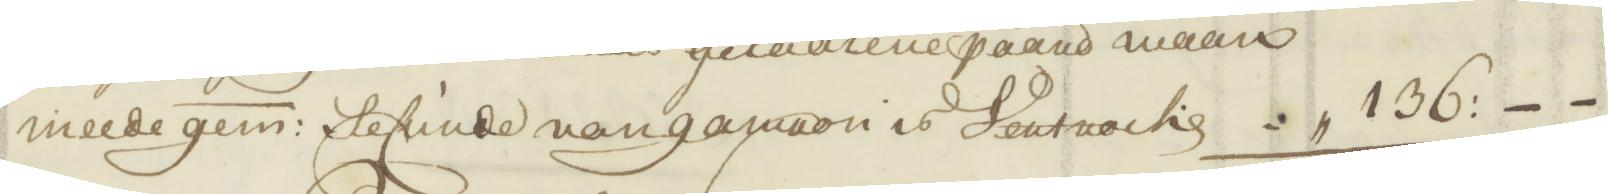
meede gem: secunde van gamron is Vertrocken -. „ 136: – –
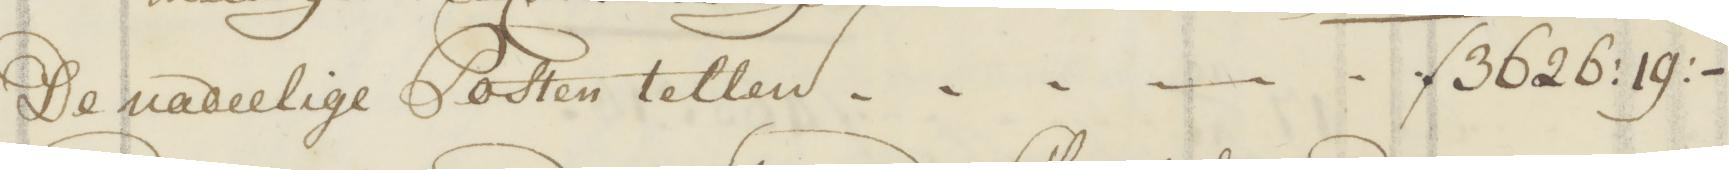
De nadeelige Posten tellen - - - - - - -ƒ3626: 19:–
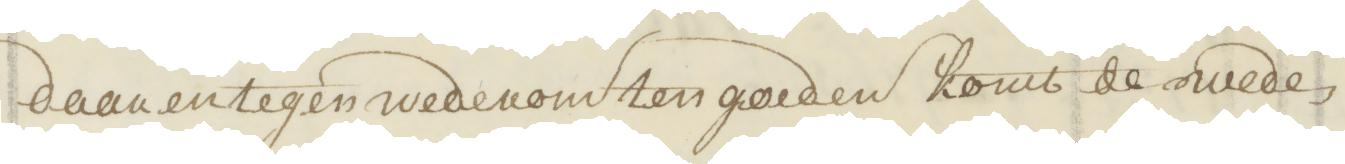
daar en tegen wederom ten goeden komt de wede,
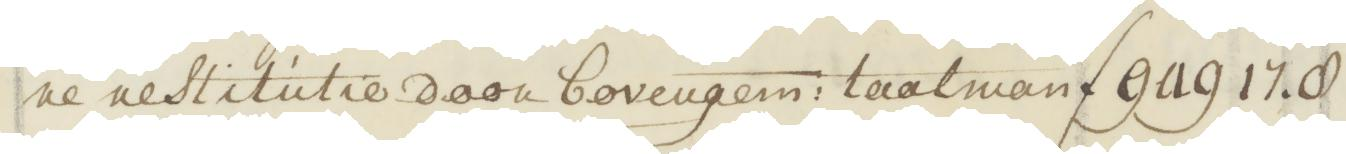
re restitutie door bovengem: taalman ƒ949 17.8
